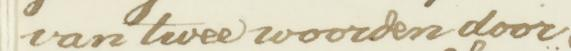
van twee woorden door
